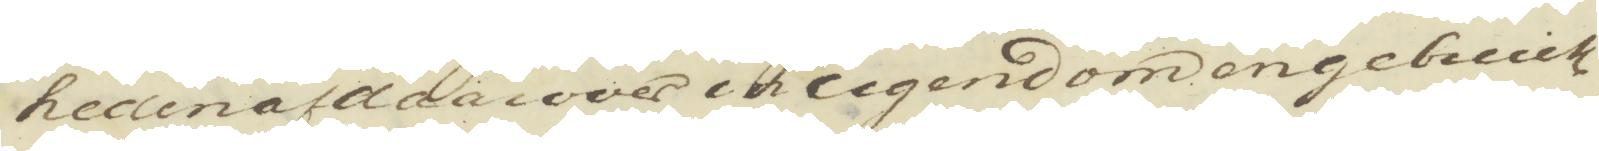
hedenaf daarover in eigendom en gebruik
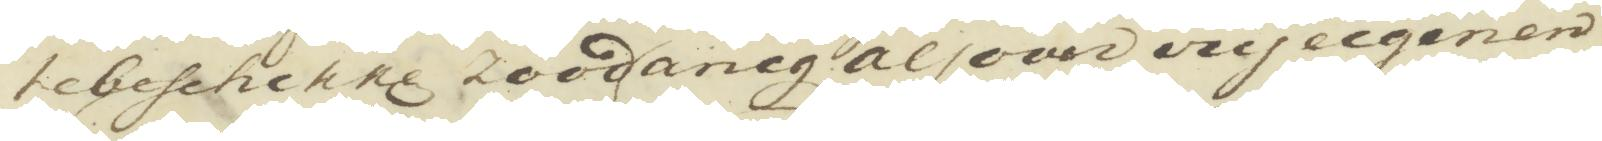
te beschikken zoodanig als over vry eigen en
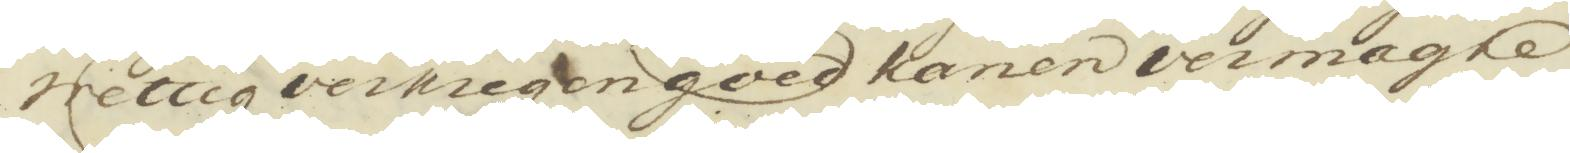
wettig verkregen goed kan en vermag te
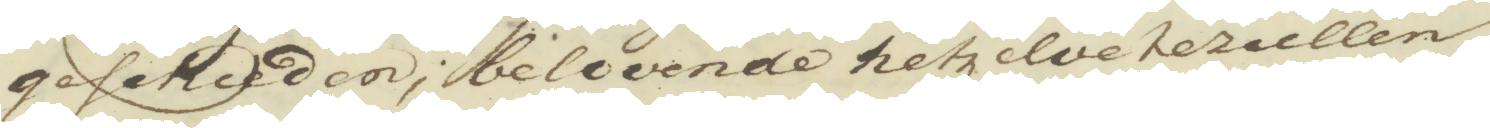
geschieden; belovende hetzelve tezullen
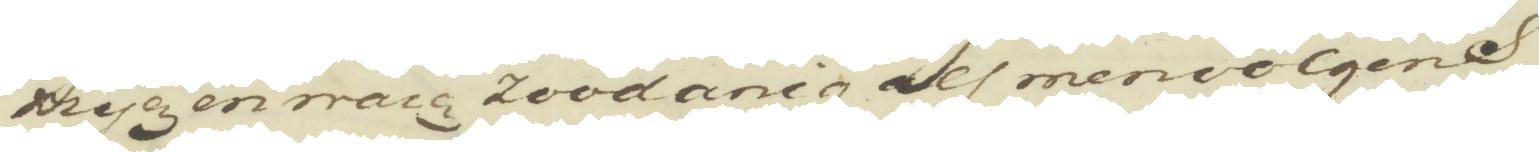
vryen en waren zoodanig als men volgens
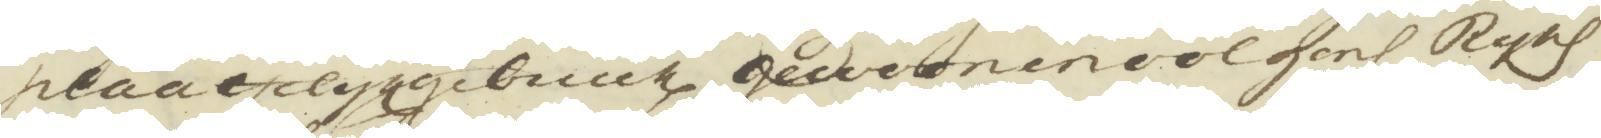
plaatselijk gebruik gewoon en volgens Ryns
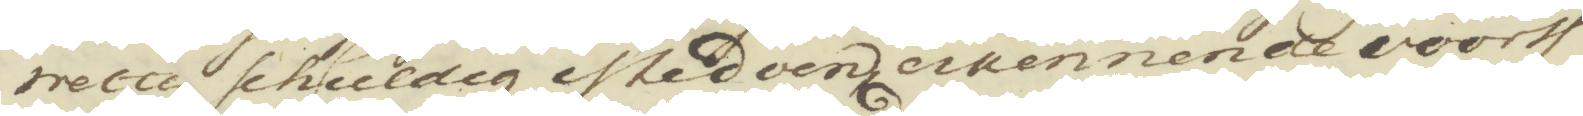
welten schuldig is te doen, erkennende voorss
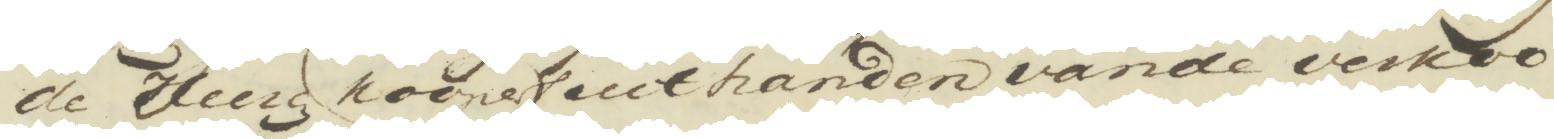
de Heeren koopers uithanden vande verkoo
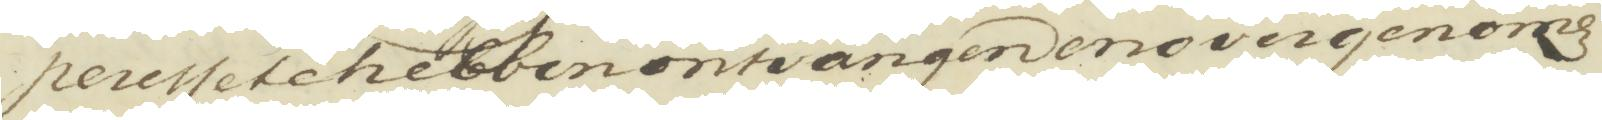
peresse te hebben ontvangen enovergenomen
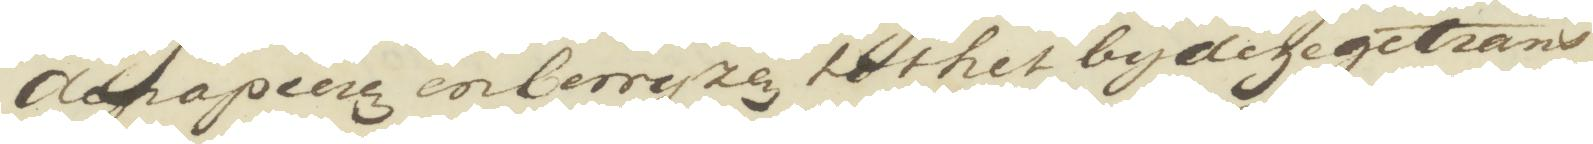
depapieren en bewyzen tot het by deze getrans
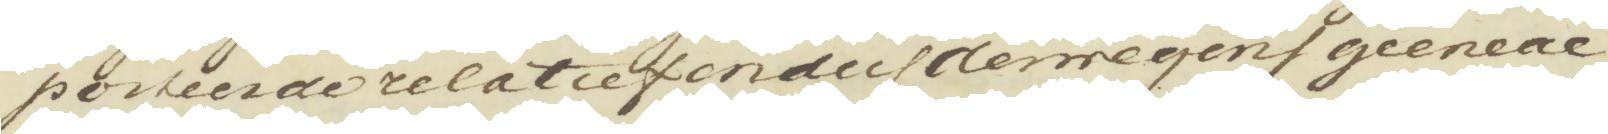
porteerde relatief endus derwegens geene ac
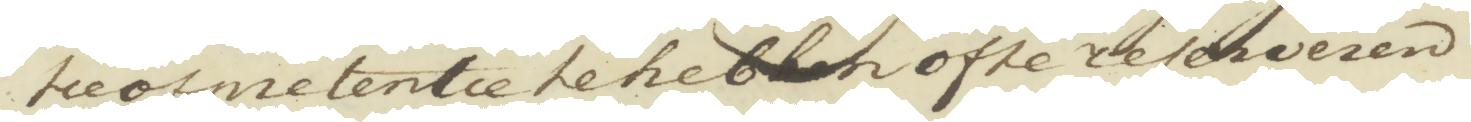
tie of pretentie te hebben of te reserveren
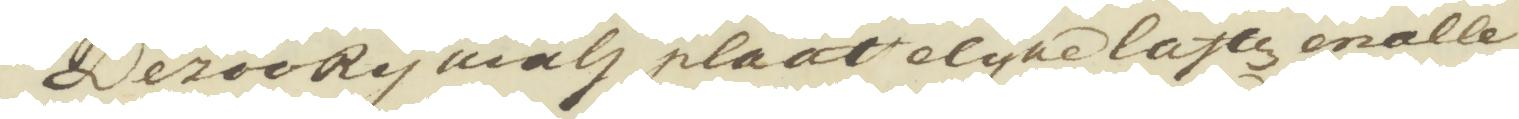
De zoo Ryks als plaat elyke lasten en alle
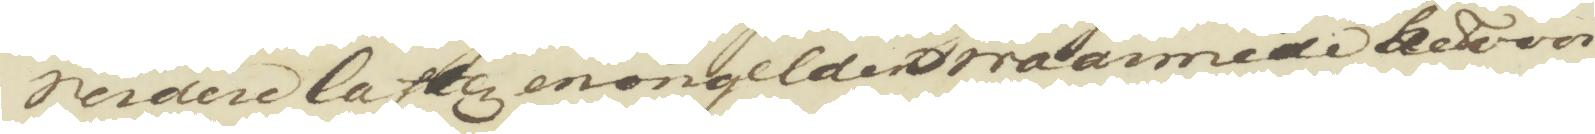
verdere lasten en ongelden waarmede hetvoor
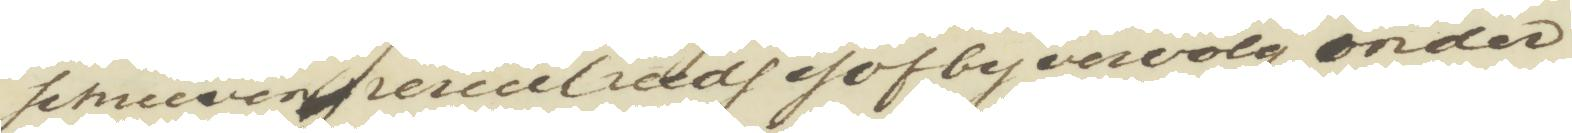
schreeven perceel reeds is of by vervolg onder
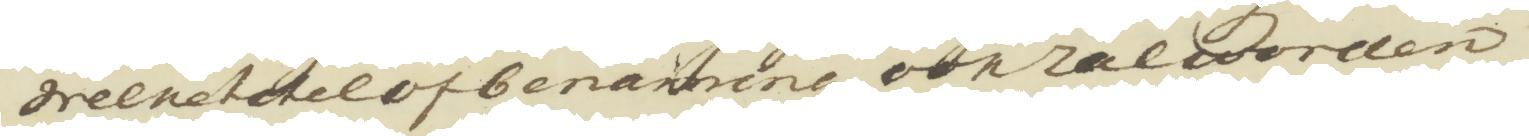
welke titel of benaming ook zal worden
